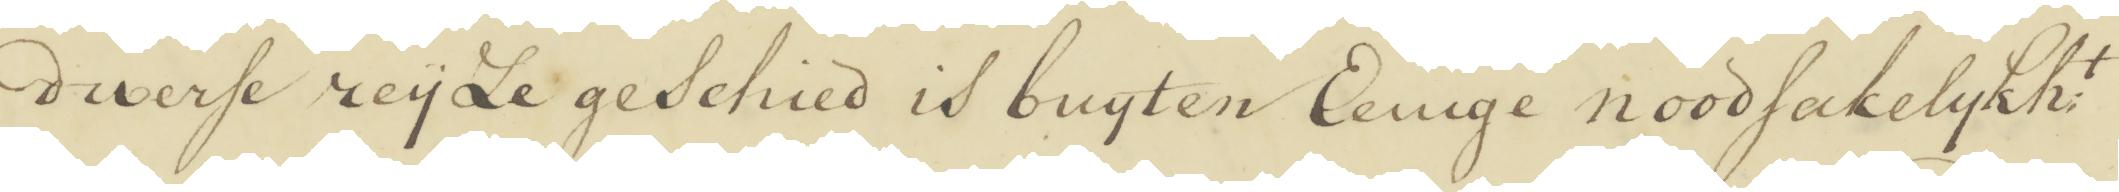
diverse reijze geschied is buyten Eenige noodsakelijkh:t
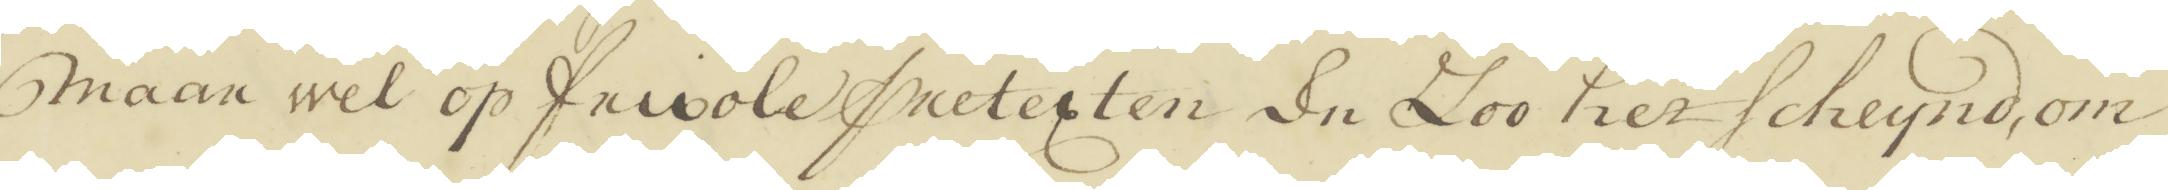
maar wel op frivole pretexten en zoo het scheynd, om
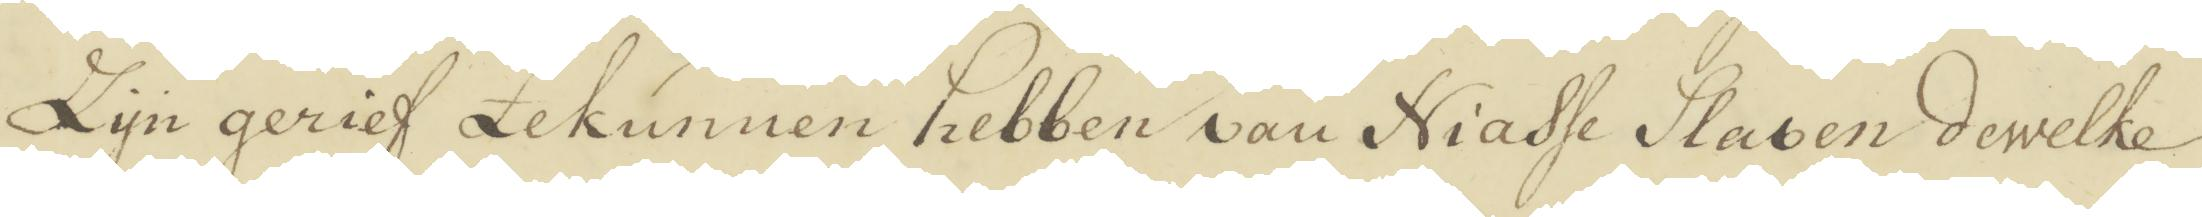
zijn gerief te kunnen hebben van Niasse slaven dewelke
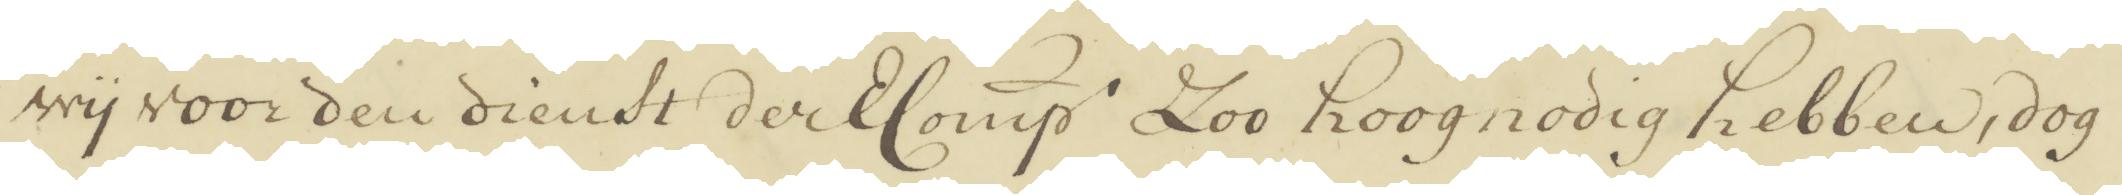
wij voor den dienst der EComp zoo hoognodig hebben, dog
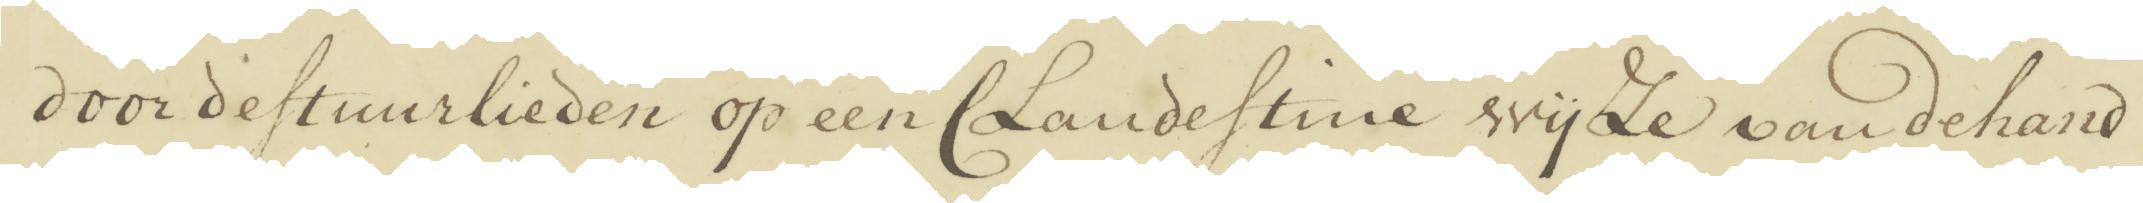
door destuurlieden op een clandestine wijze van dehand
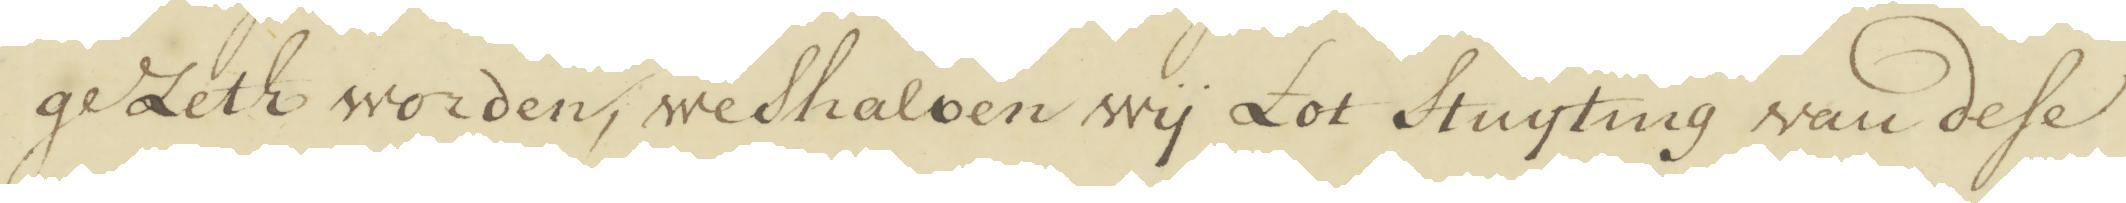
gezeth worden, weshalven wij tot stuyting van dese
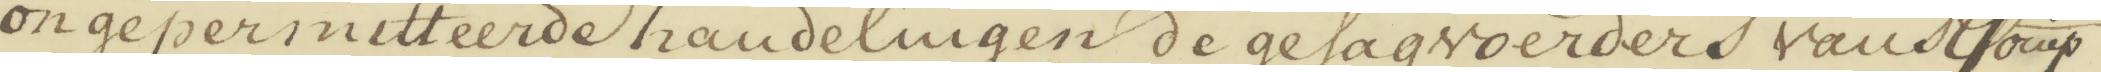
ongepermitteerde handelingen de gesagvoerders van sEComp-s
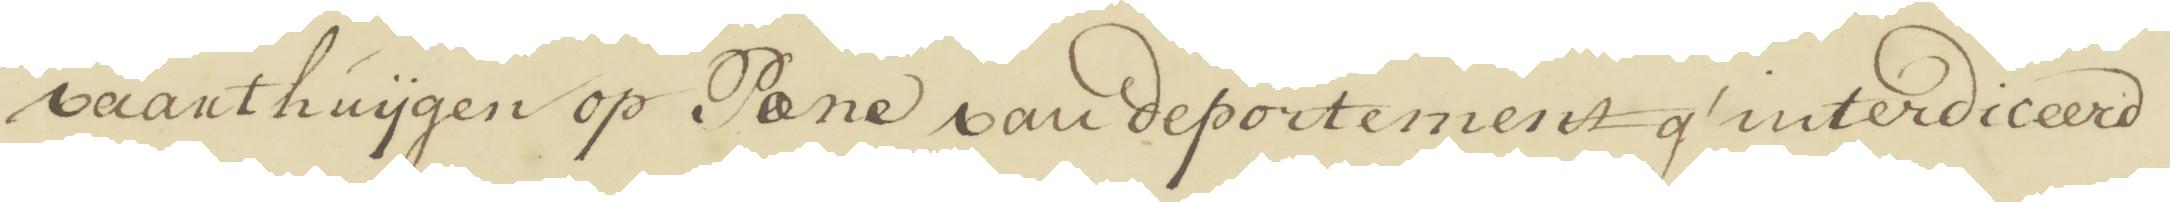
vaarthuijgen op Pone van deportement g’interdiceerd
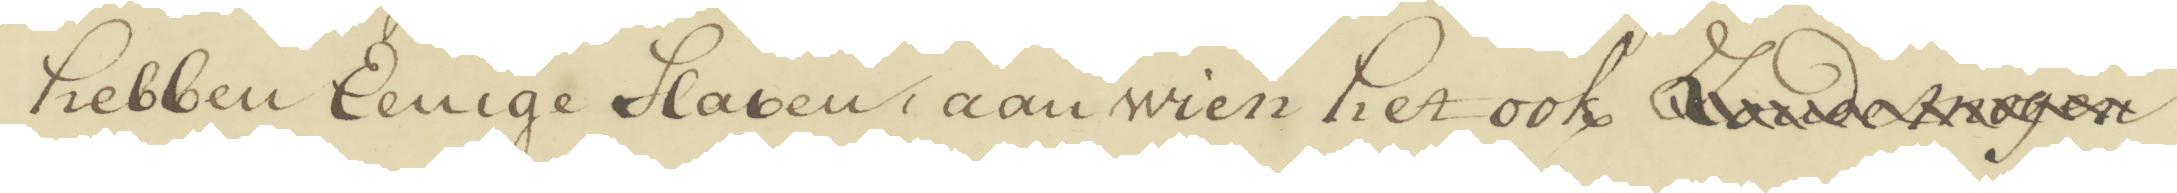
hebben Eenige slaven, aan wien het ook zoudemogen
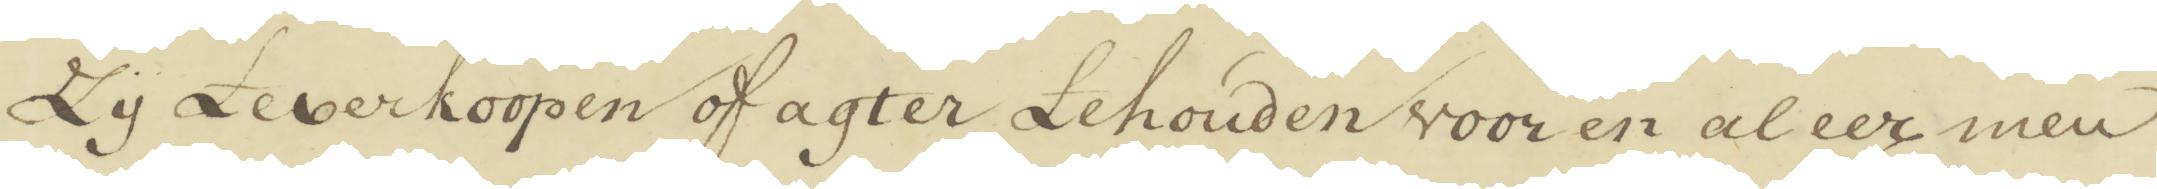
zij teverkoopen of agter tehouden voor en al eer men
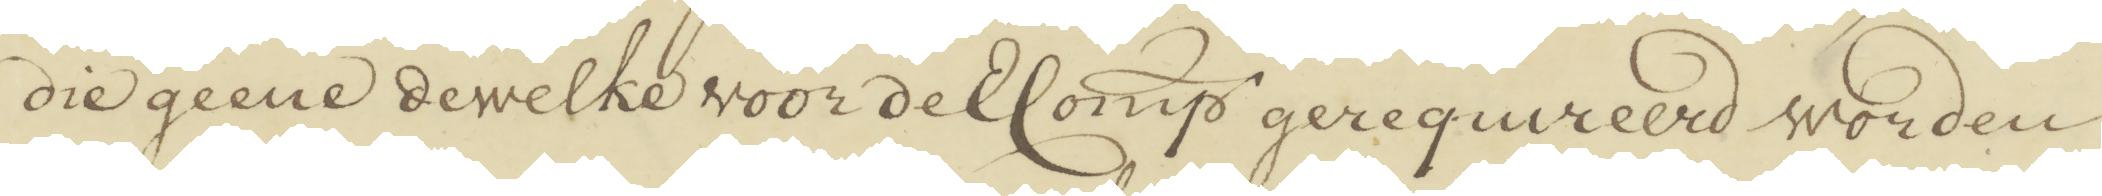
die geene dewelke voor de EComp gerequireerd worden
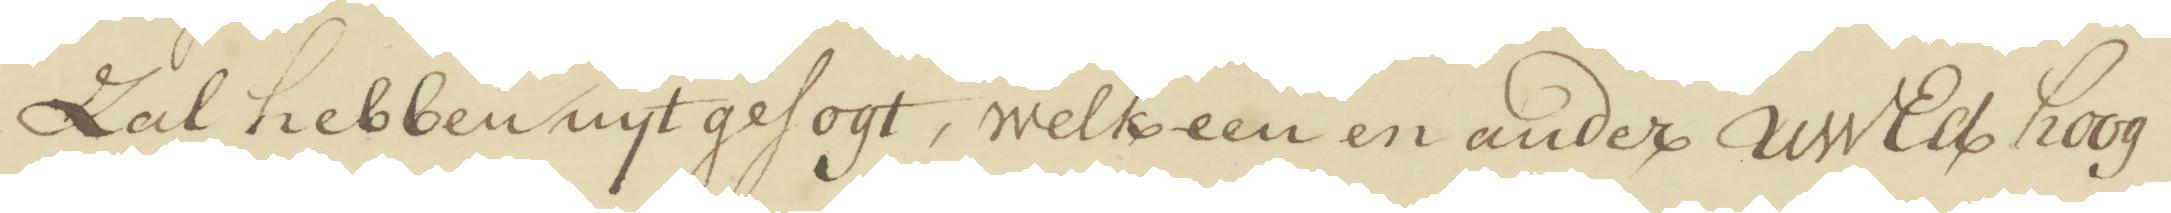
zal hebben uytgesogt, welk een en ander uw Ed hoog
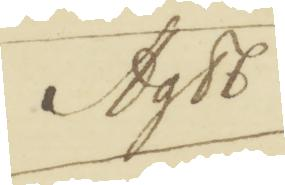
Agtb
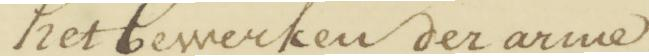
het bewerken der arme
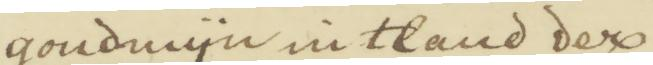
goudmijn in tland der
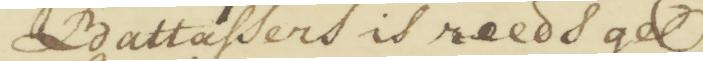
Battassers is reeds ge
